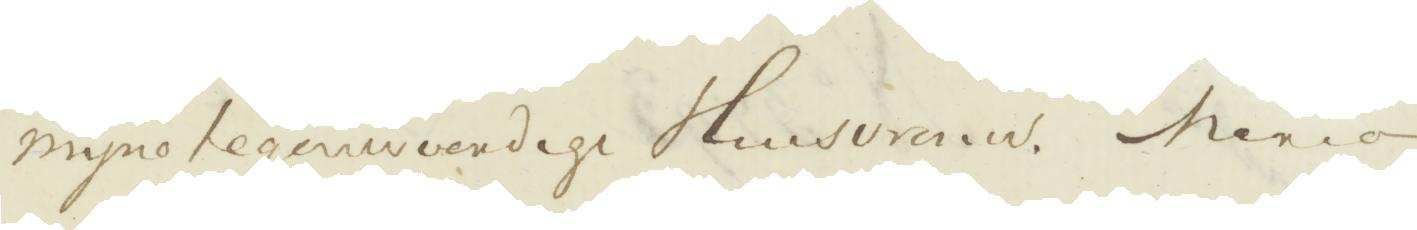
myne tegenwoordige Huisvrouw. Maria
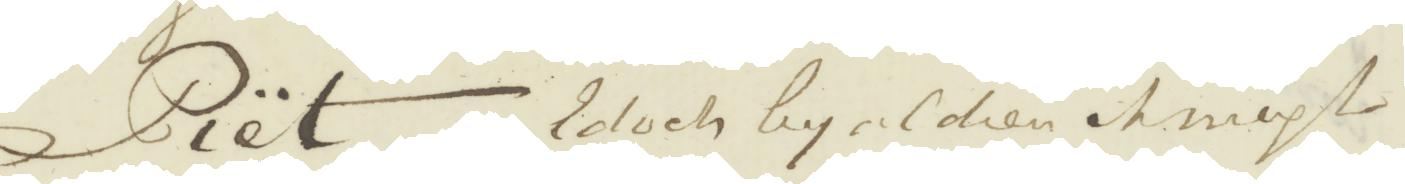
Piët Edoch by aldien ik mogte
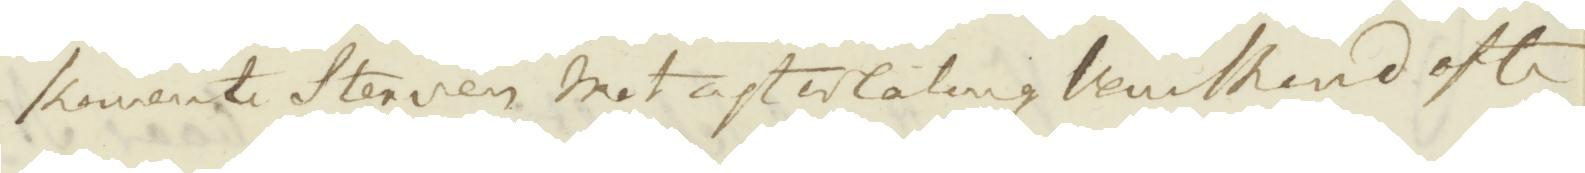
komen te sterven met agterlating van kind ofte
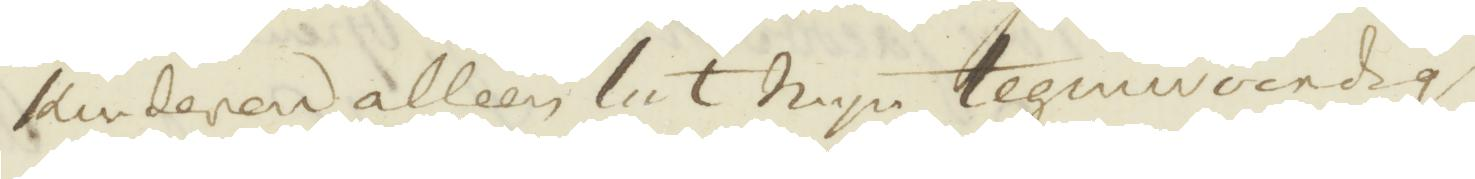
kinderen, alleen tot myn tegenwoordig
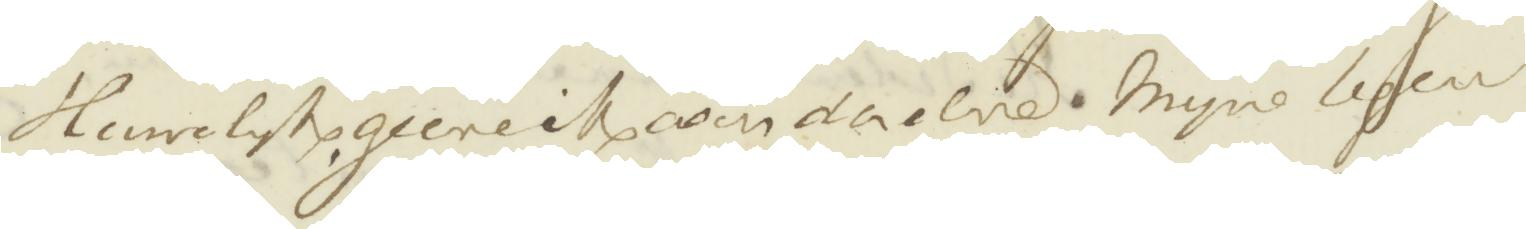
Huwelyk, geeve ik aan dezelve myne tegen
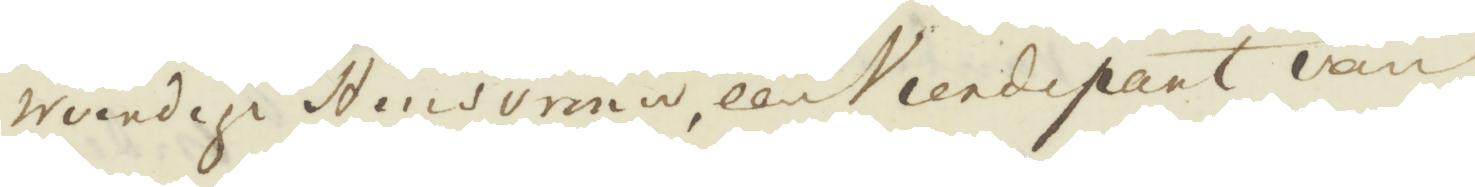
woordige Huisvouw, een Vierdepart van
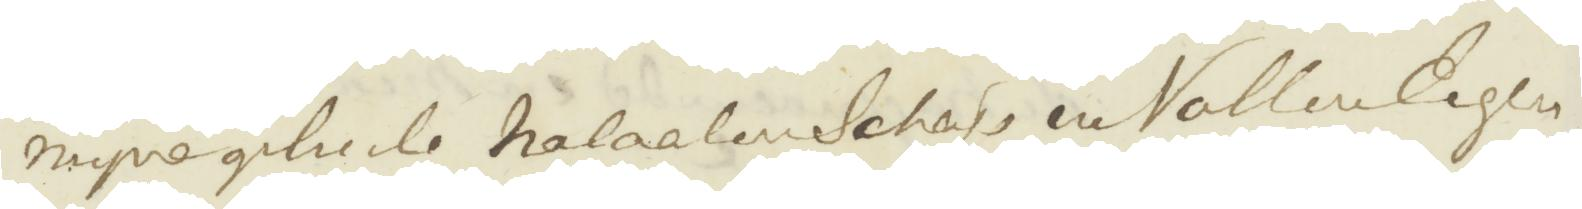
myne geheele nalaatenschap in Vollen Eigen
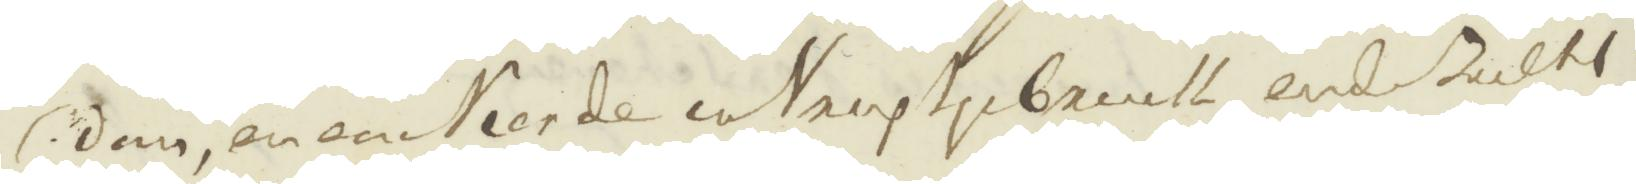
dom, en den Vierde in Vrugtgebruik, ende zulks
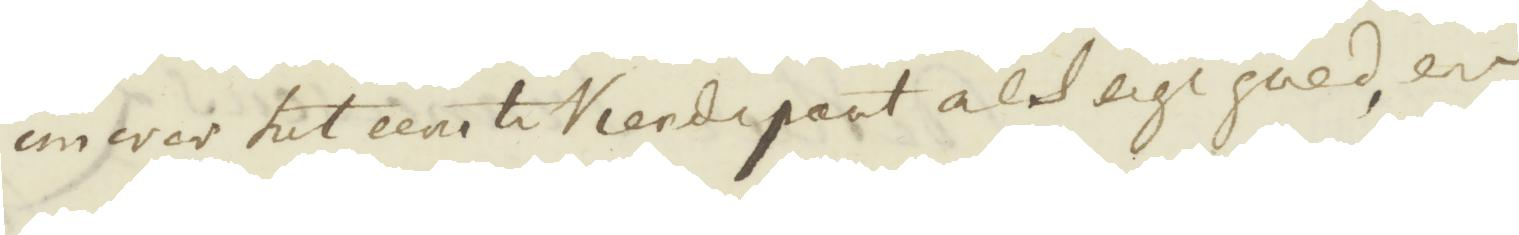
om over het eerste Vierdepart als regt gold, en
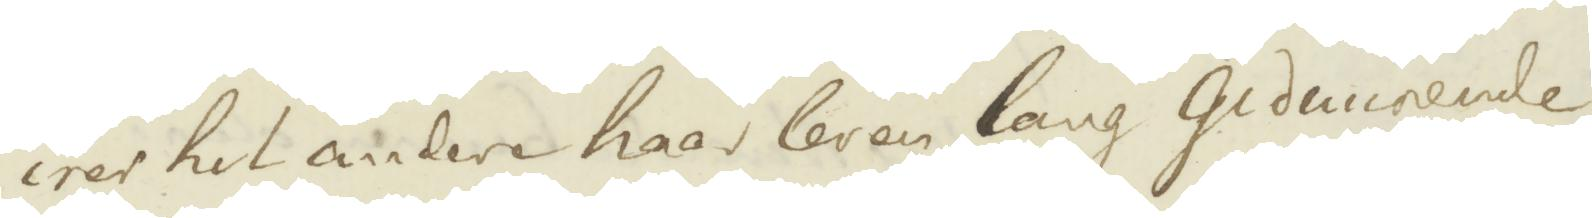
over het andere haar leven lang geduurende
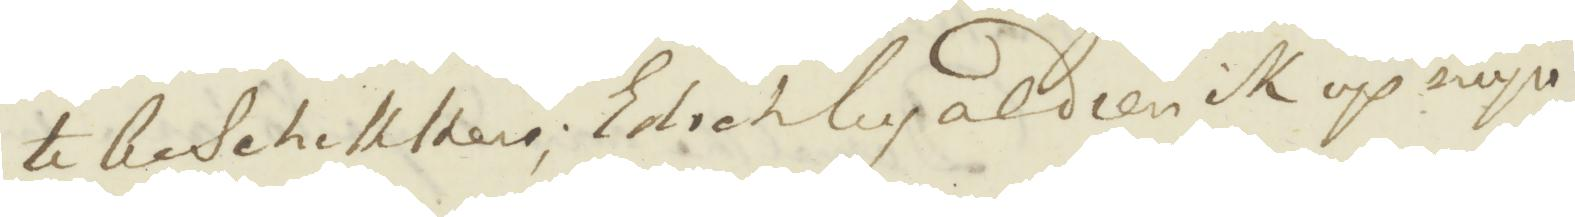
te beschikken; Edoch by aldien ik op myn
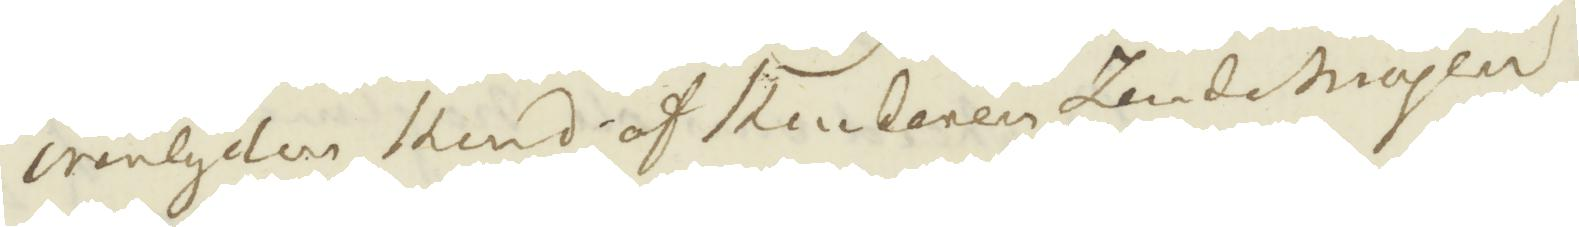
overlyden kind of kinderen zoude mogen
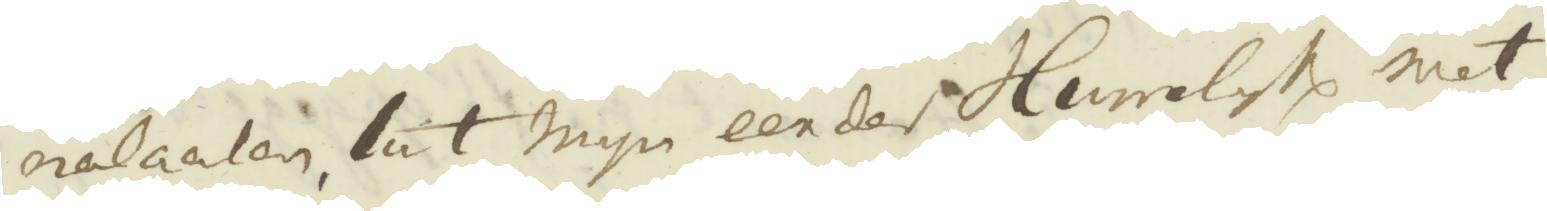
nalaaten, uit mijn eerder Huwelyk met
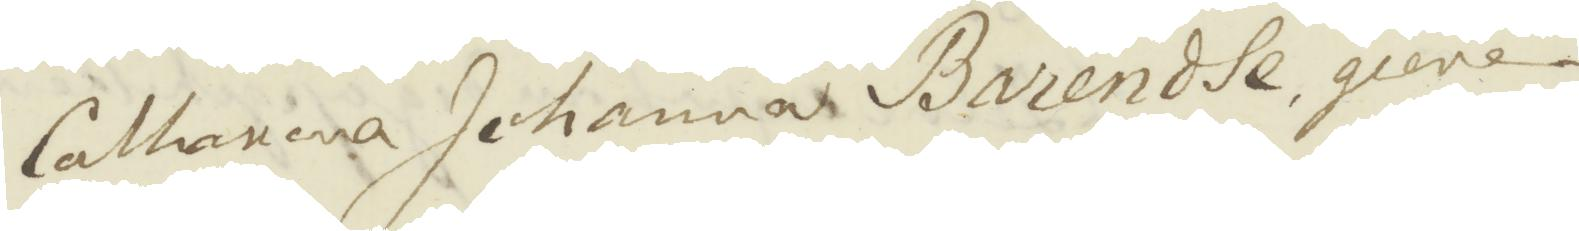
Catharina Johanna Barendse, geeve
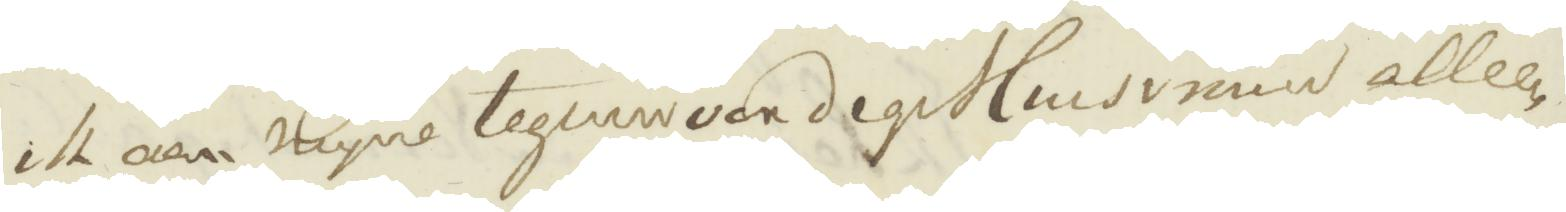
ik aan myne tegenwoordige Huisvrouw alleen
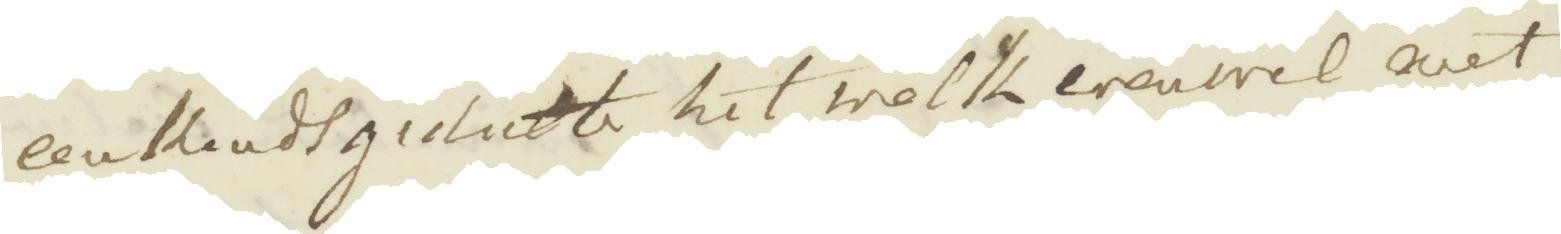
een kindsgedeelte het welk evenwel niet
